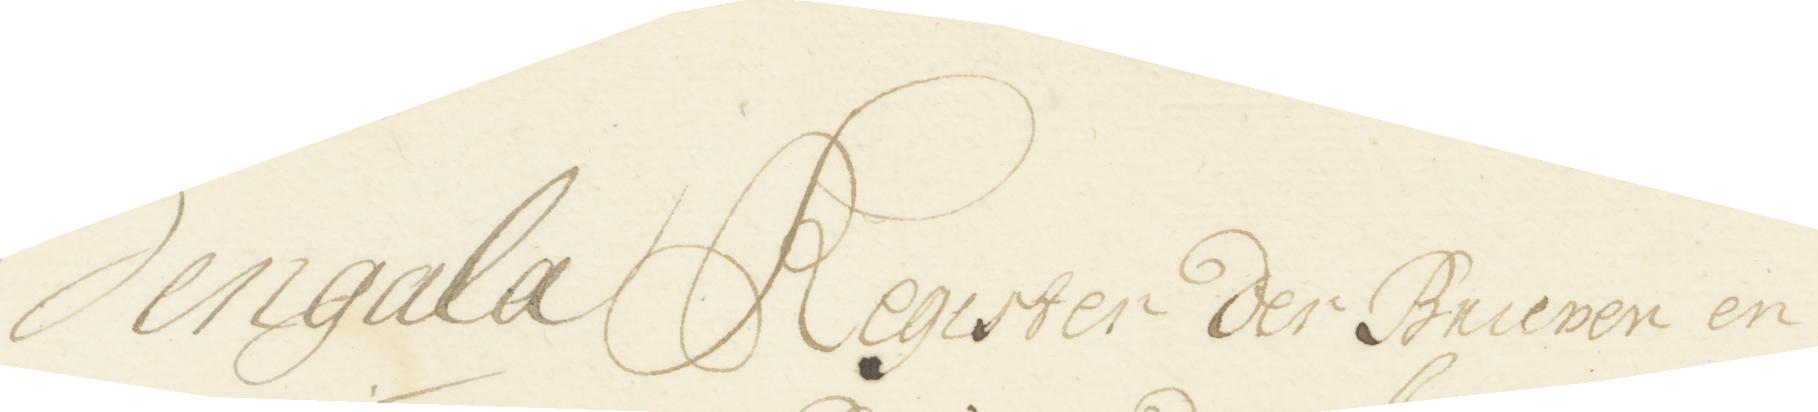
Bengala Register der Brieven en
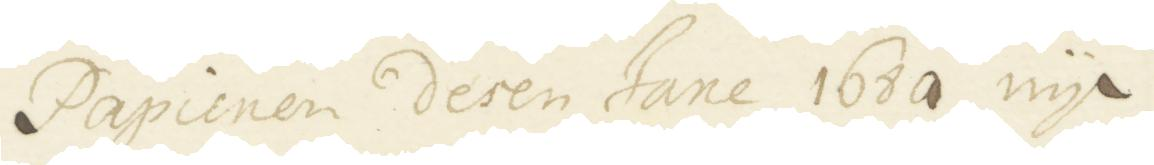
Papieren desen Iare 1684 uijt
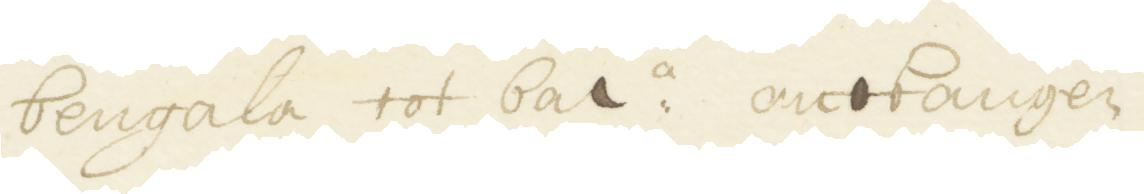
bengala tot bat:a ontfangen
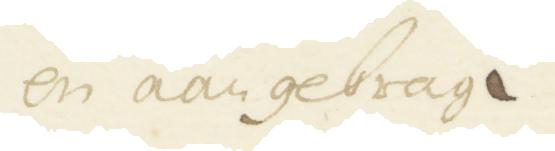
en aangebragt
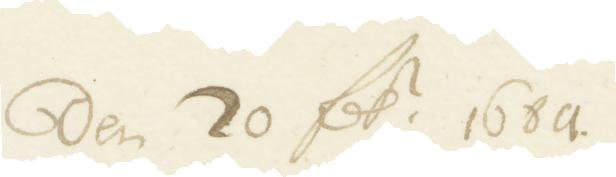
den 20 feb: 1684.
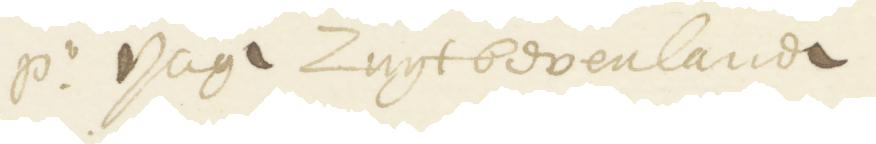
p.r Jagt Zuijtbeverlandt
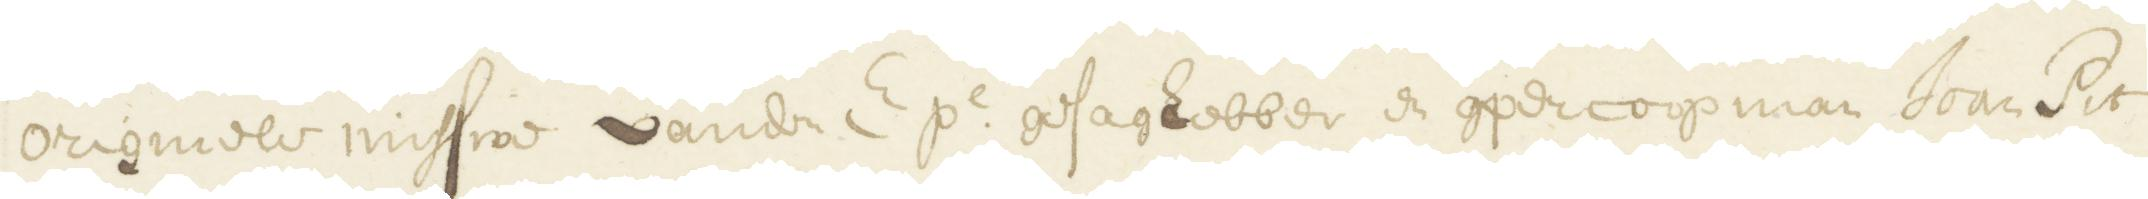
originele missive van den E p.l gesaghebber en oppercoopman Joan Pit
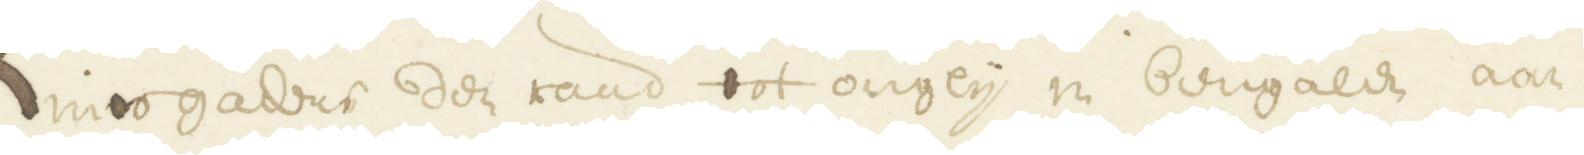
mitsgaders den raad tot onglij in bengalen aan
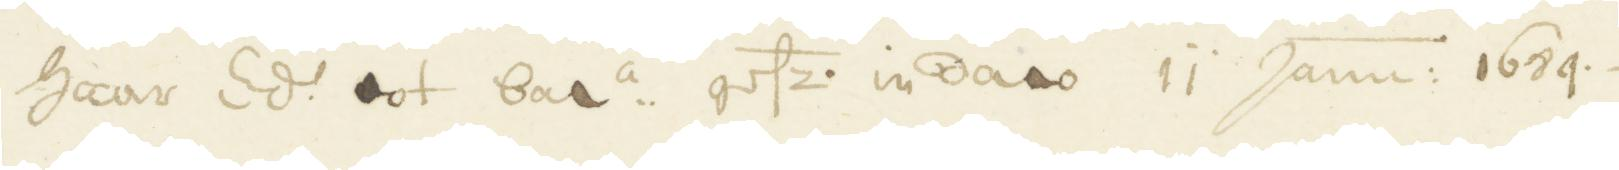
haar Ed: tot bat„a gesz: in dato 11 Janu: 1684.—
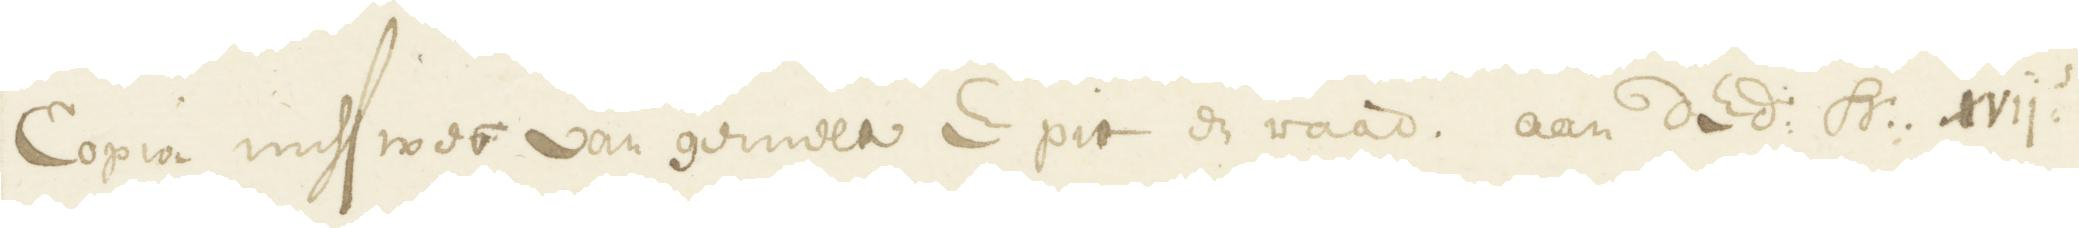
Copia missives van gemelte E pit en raad. aan d Ed: H.:, wij„s
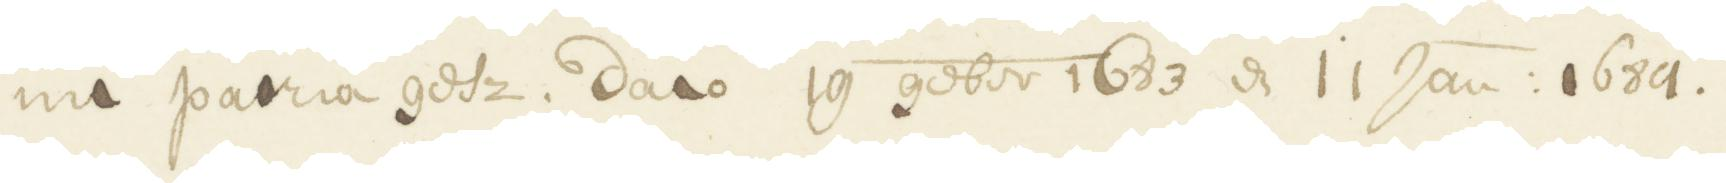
int patria gesz. dato 19 9eber 1683 en 11 Jan: 1684.
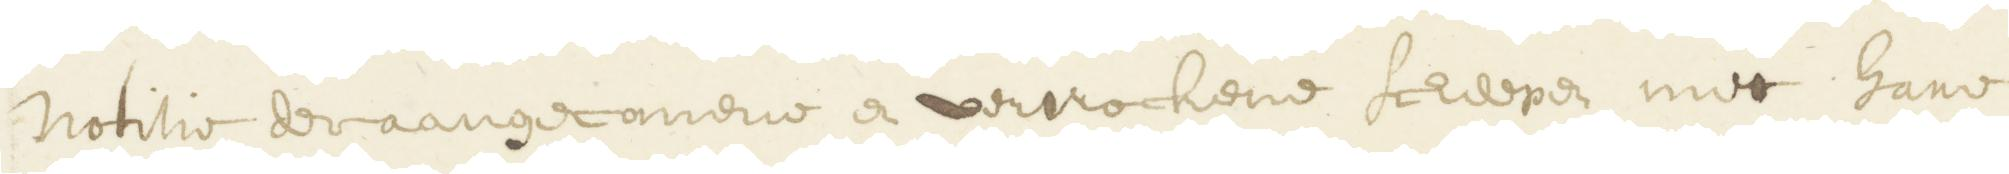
notitie der aangecomene en vertrockene scheepen met hare
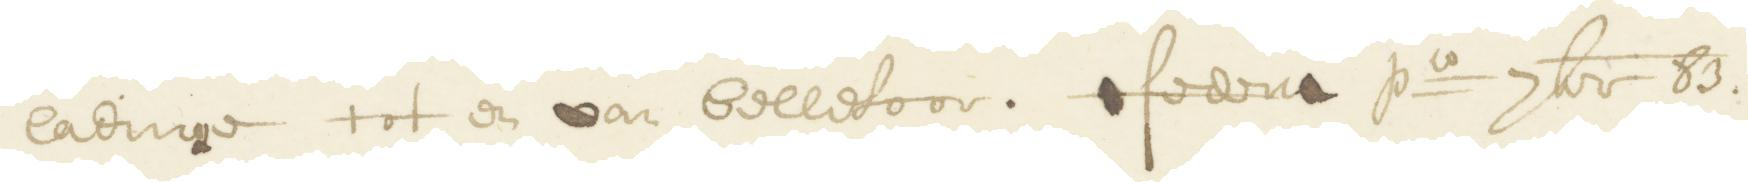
ladinge tot en van bellesoor. tsedert p=o 7ber 83
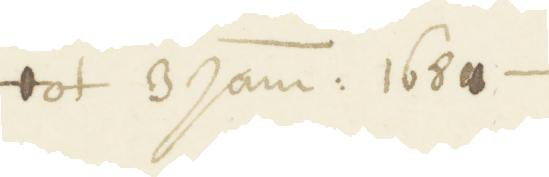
tot 3 Janu: 1684 —
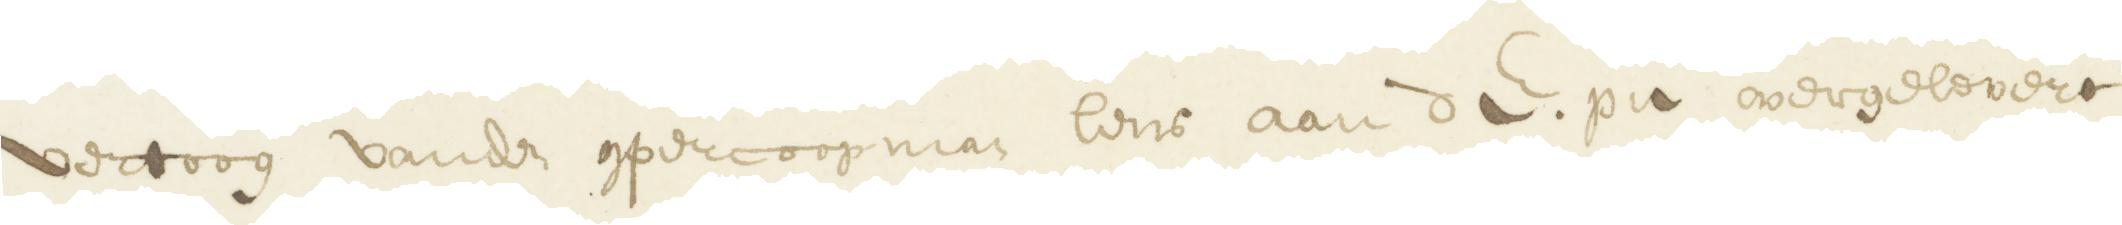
vertoog van den oppercoopman lens aan d E. pit overgelevert
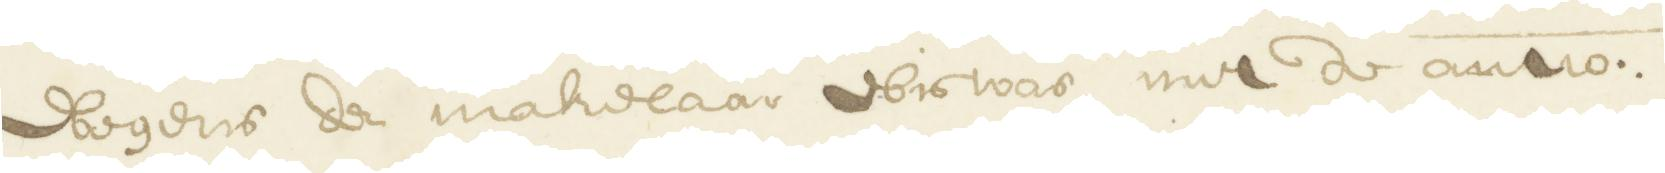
wegens den makelaar wiswas met de antw.
